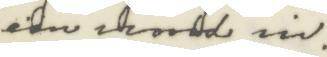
een woord in
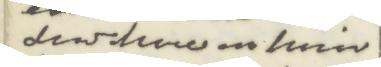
den twee en twin
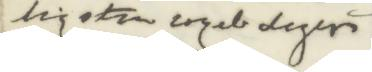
tigsten regel dezer
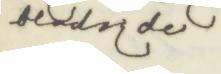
bladzyde
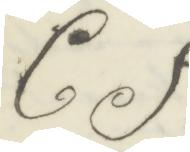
C S
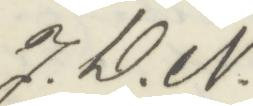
J.D.N.
